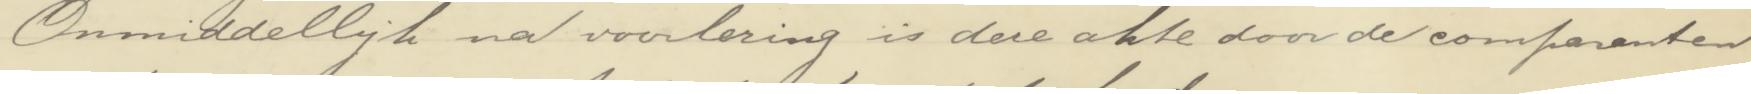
Onmiddellijk na voorlezing is deze akte door de comparanten
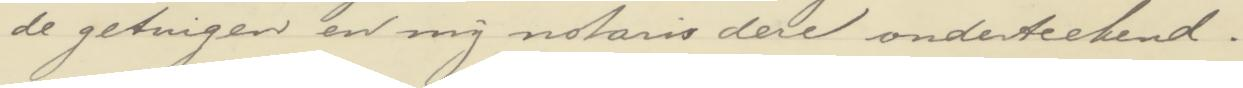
de getuigen en mij notaris deze onderteekend
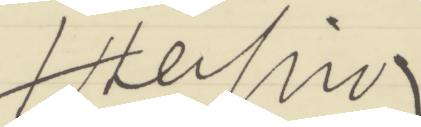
Jhessing
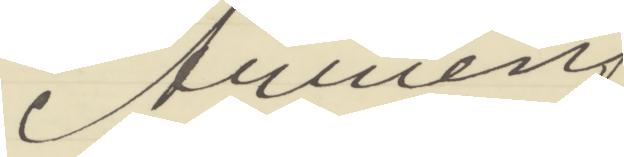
Arriens
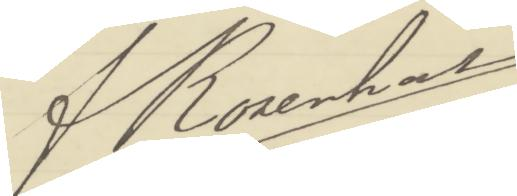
f Rozenhart
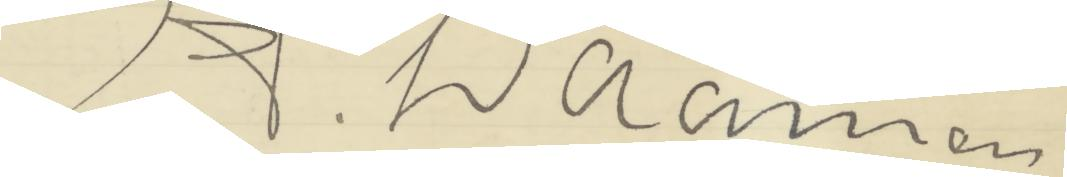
A. Daamen
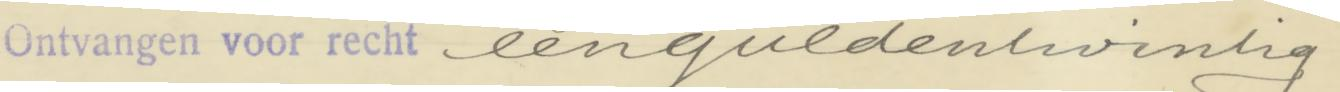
een guldentwintig
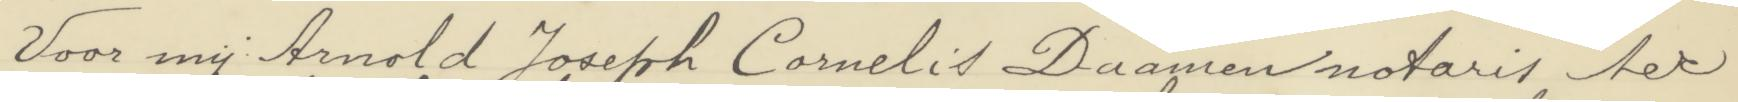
Voor mij Arnold Joseph Cornelis Daamen notaris ter
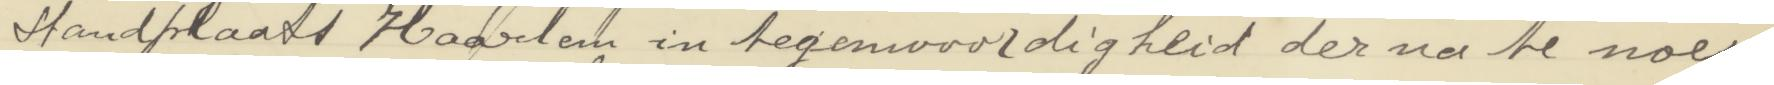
standplaats Haarlem in tegenwoordigheid der na te noe:
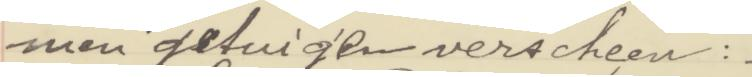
men getuigen verscheen:
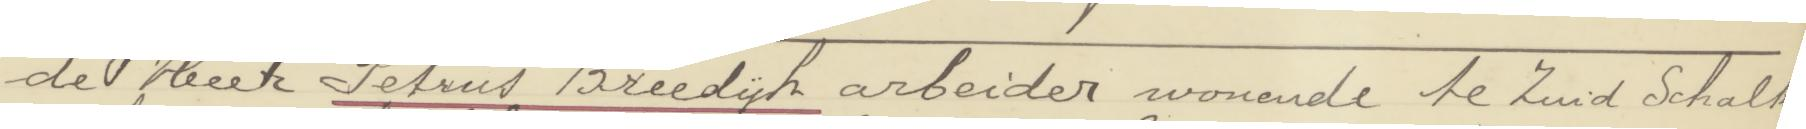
de Heer Petrus Breedijk arbeider wonende te Zuid Schalk
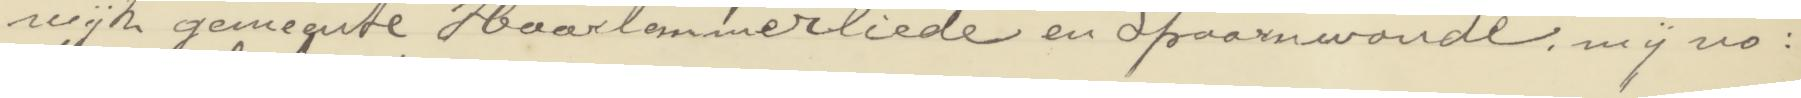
wijk gemeente Haarlemmerliede en Spaarnwoude, mij no:
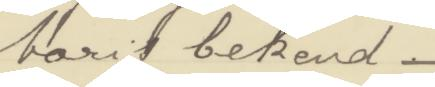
taris bekend.
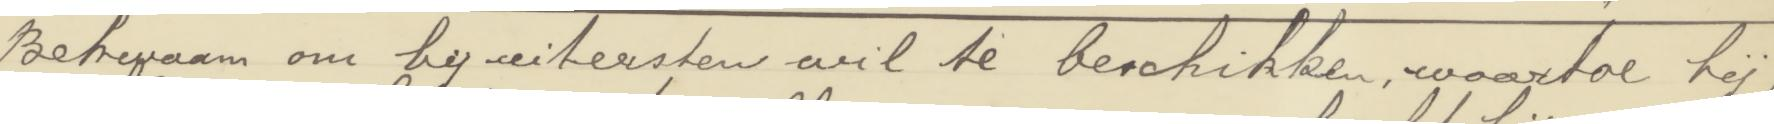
Bekwaam om bij uitersten wil te beschikken, waartoe hij
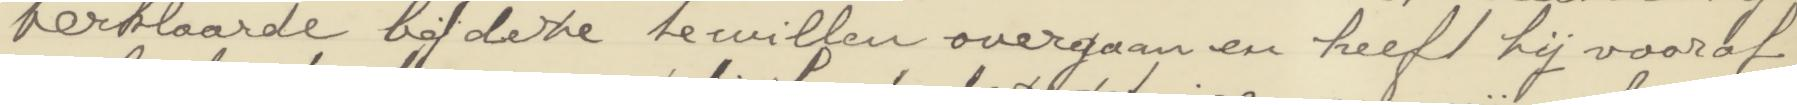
verklaarde bij deze te willen overgaan en heeft hij vooraf
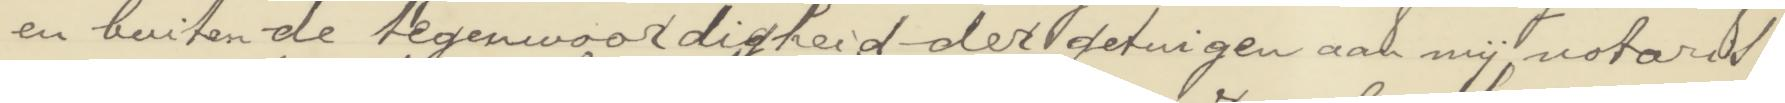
en buiten de tegenwoordigheid der getuigen aan mij notaris
